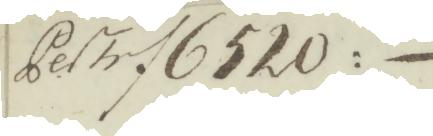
Per Tr ƒ6520 : —
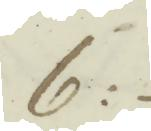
6 :
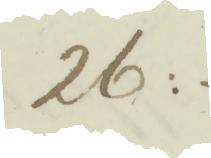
26 :
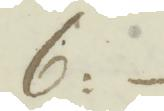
6:—
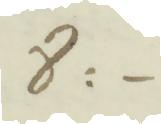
8 : —
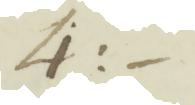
4 : —
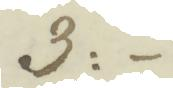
3 : —
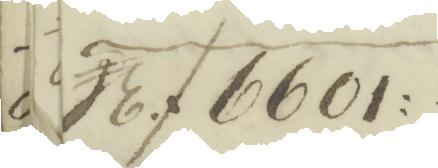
Tr ƒ 6601:
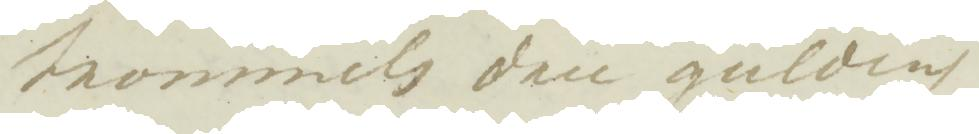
trommels drie guldens
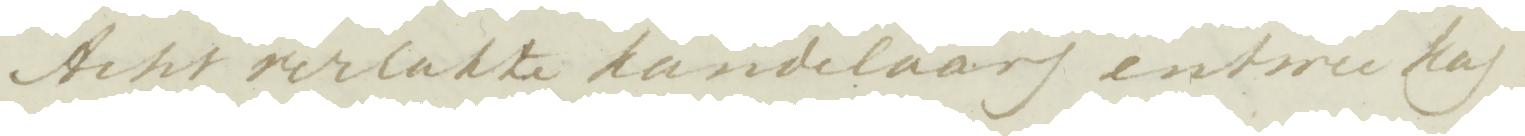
Acht verlakte kandelaars en twee kas
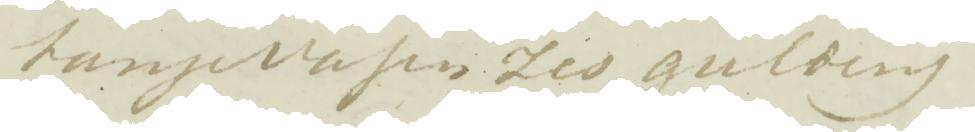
tanjevasen zes guldens
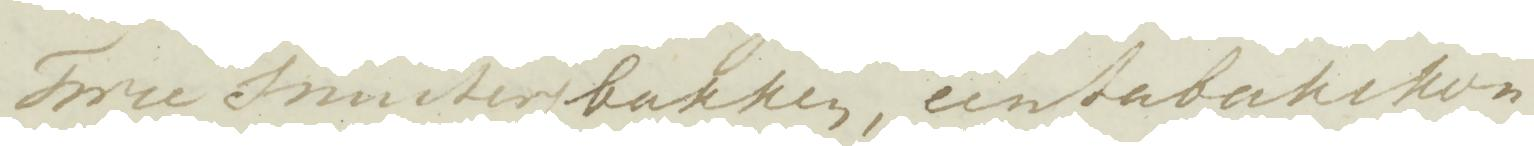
Twee snuiters bakken, een tabakskon
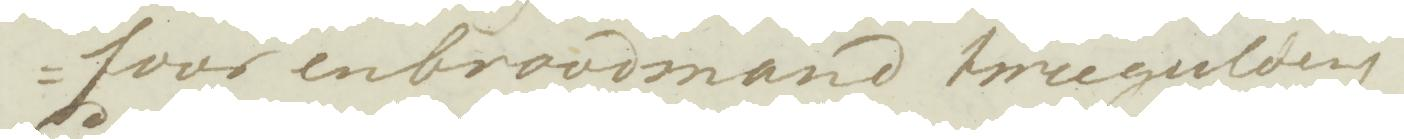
=foor enbroodmand tweeguldens
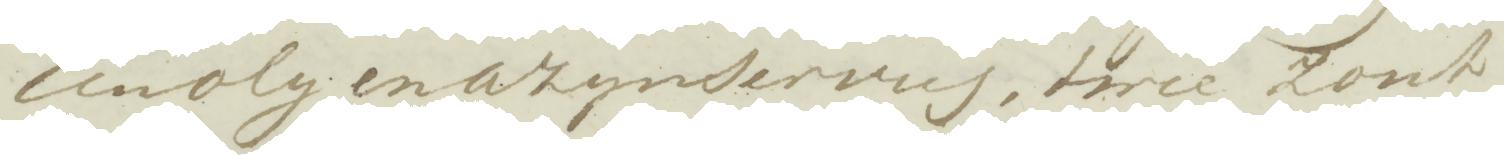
Eenoly en azynservies, twee zout
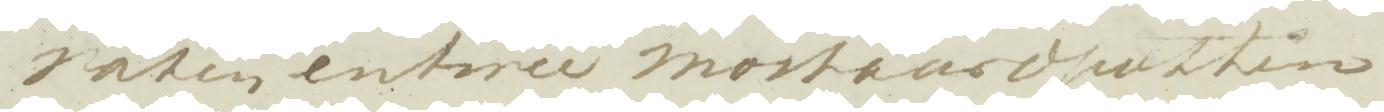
vaten en twee mostaardpotten
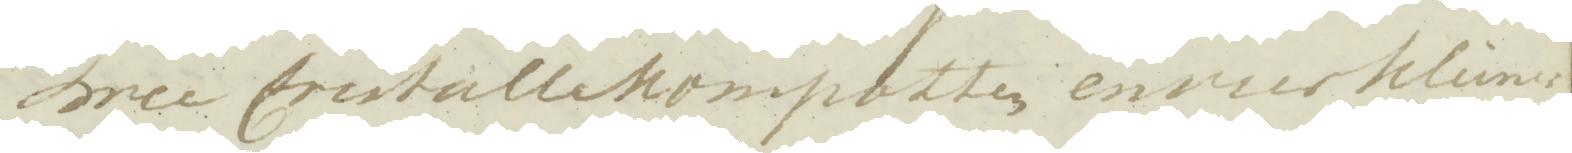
Twee Cristallekompotten en vier kleine
